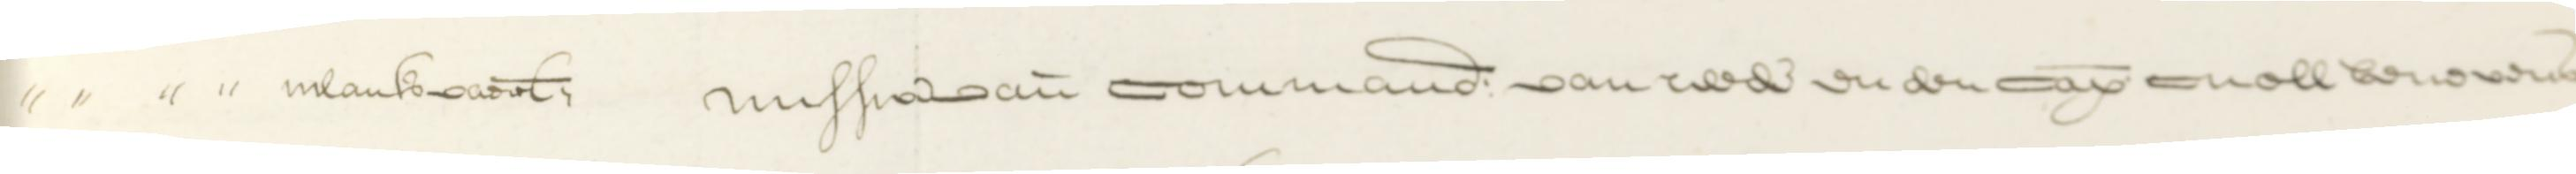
„ „ „ „ inlants vaerten missive van command: van reede en den cap: cnoll benevens
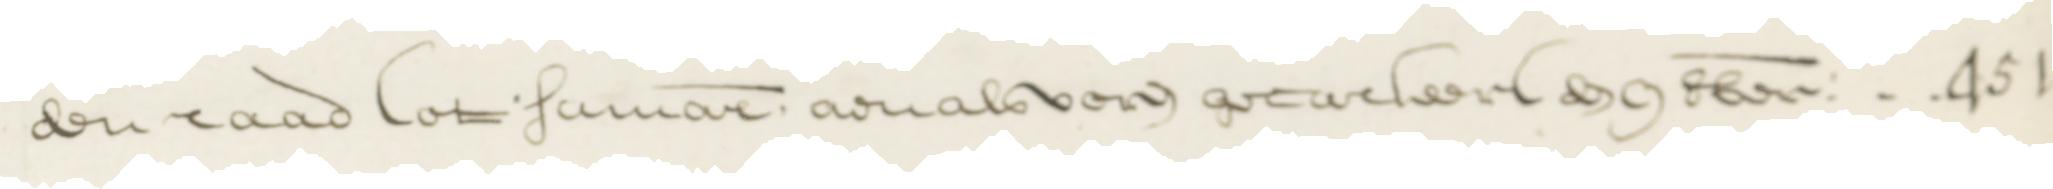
den raad tot samar: aen als voren gecarteert den 9 8ber: . . 451
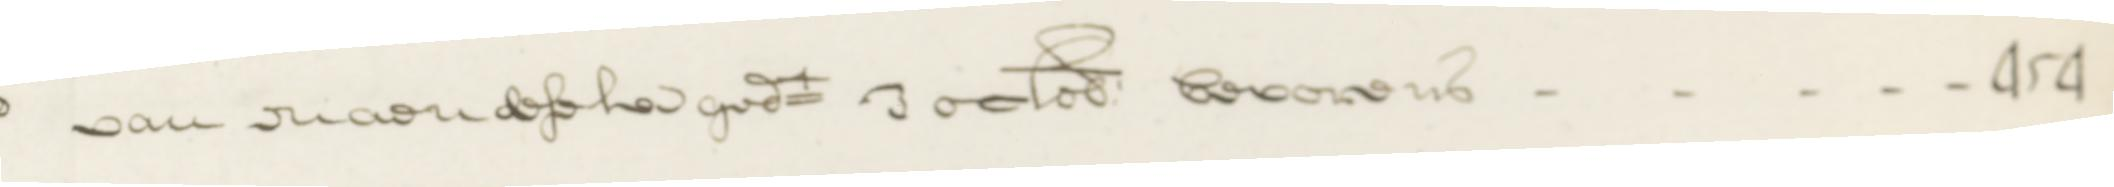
van en aen deselve ged=t 3 octob: bevorens . . . . . 454
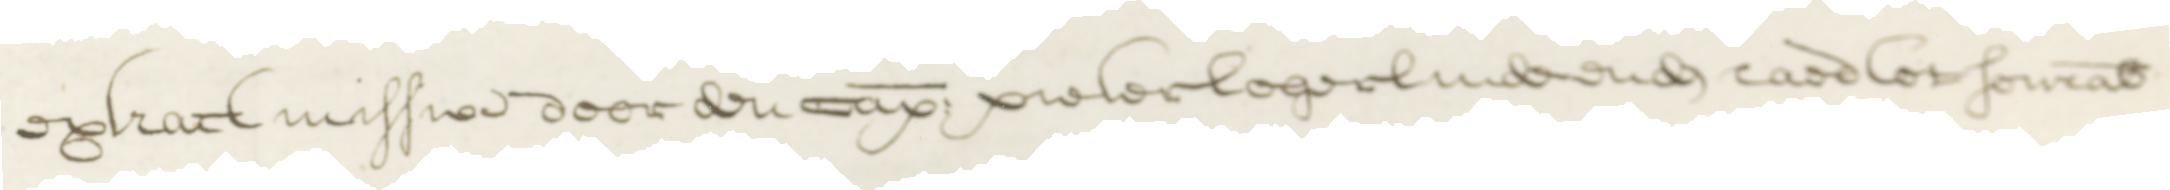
extract missive door den cap: pieter hogerlinde en den raed tot sourab
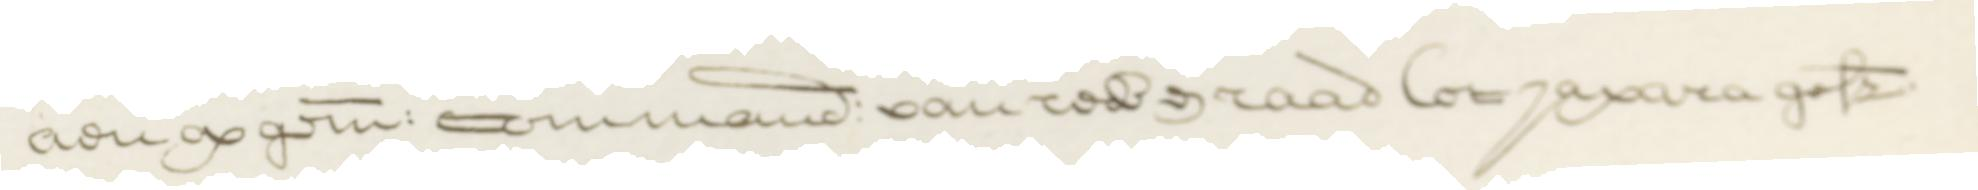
aen op gem: command: van rede en raad tot japara gesz
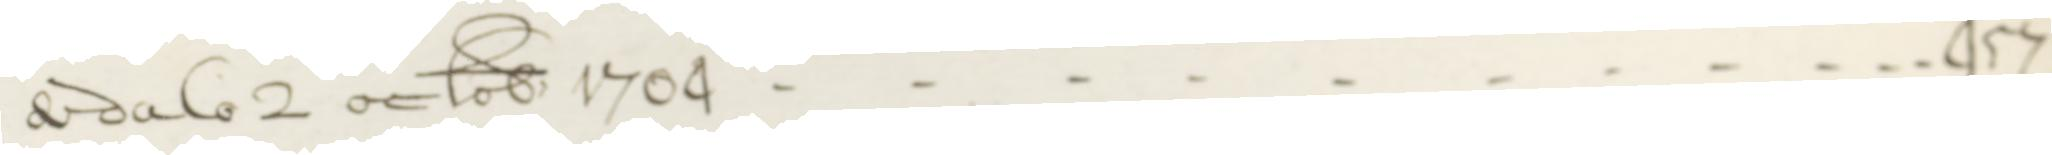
de dato 2 octob: 1704 . . . . . . . . . . . 457
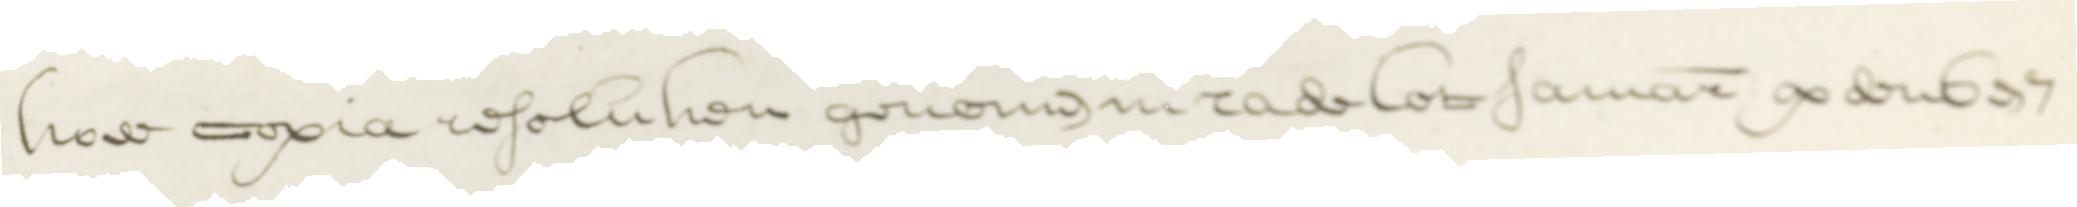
twee copia resolutien genomen in rade tot samar op den 6 en 7
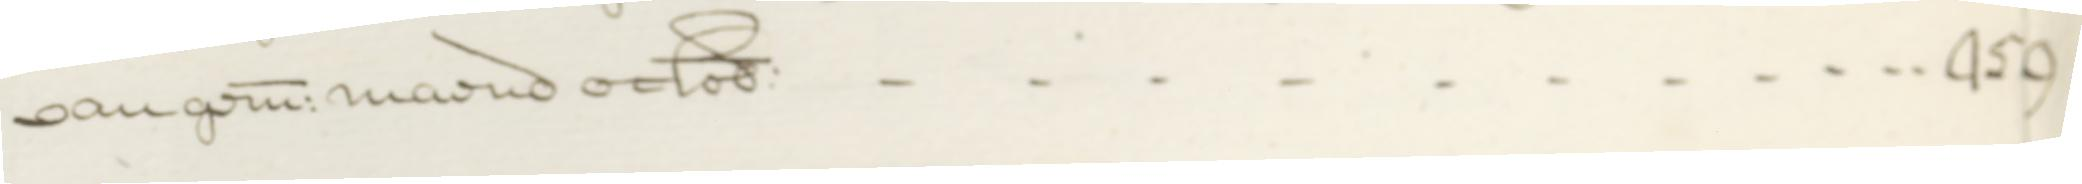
van gem: maend octob: . . . . . . . . . . . 459
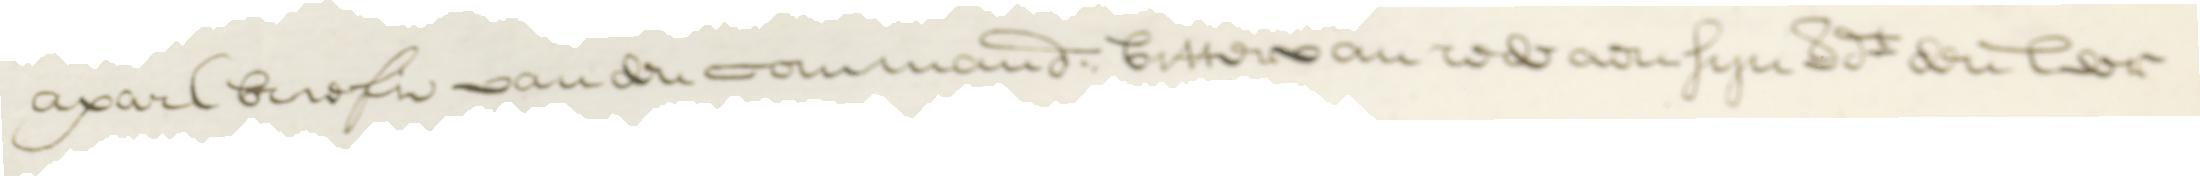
apart briefie van den command: bitter van rede aen sijn Ed=t den heer
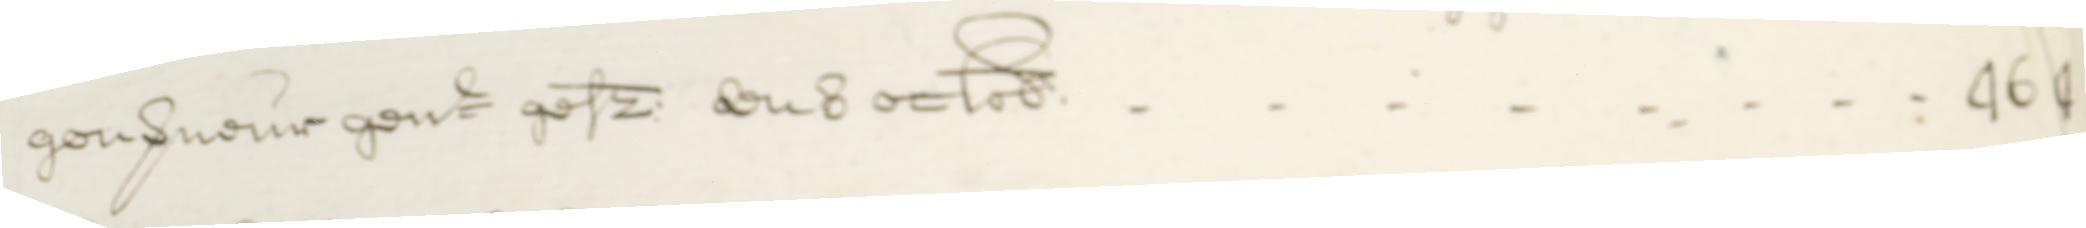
gouverneur gen=l gesz: den 8 octob: . . . . . . . . 464
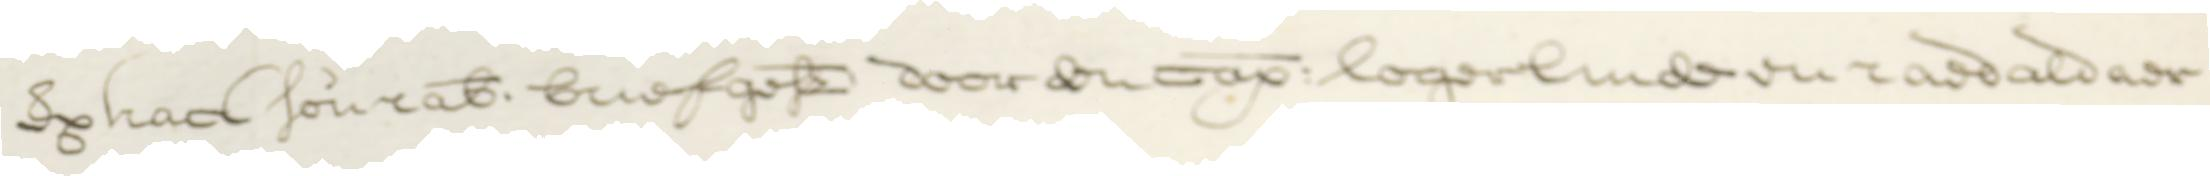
Extract sourab. brief gesz: door den cap: hogerlinde en raed aldaer
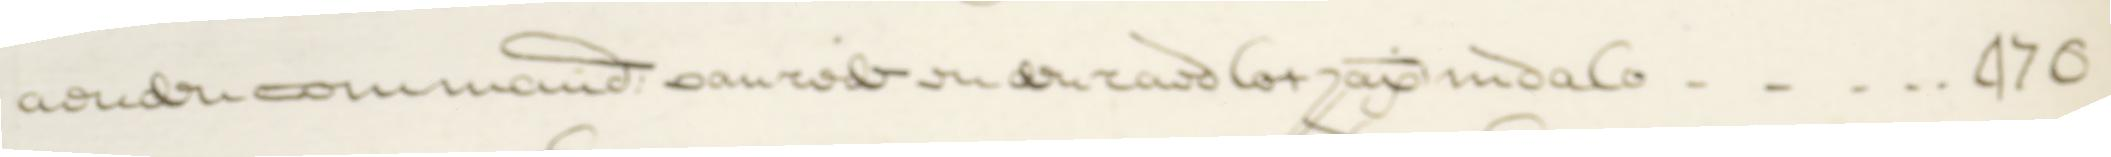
aen den command: van rede en den raed tot jap in dato . . . . . 470
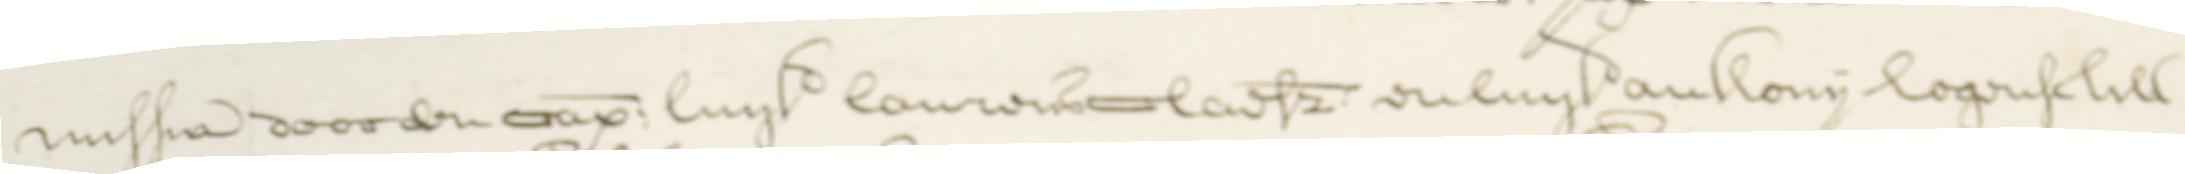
missive door den cap: luijtd laurens claesz: en luijtd anthonij hogenschilt
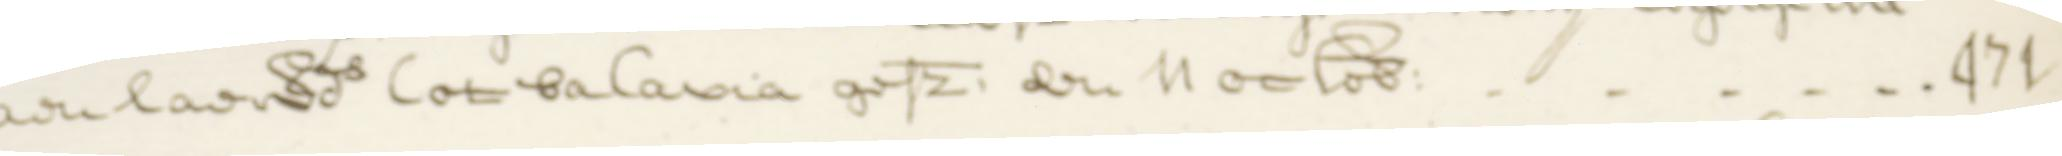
aen haer Eds tot batavia gesz: den 11 octob: . . . . . . 471
